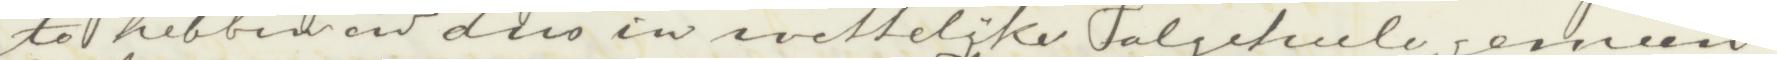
te hebben en dus in wettelijke algeheele gemeen
